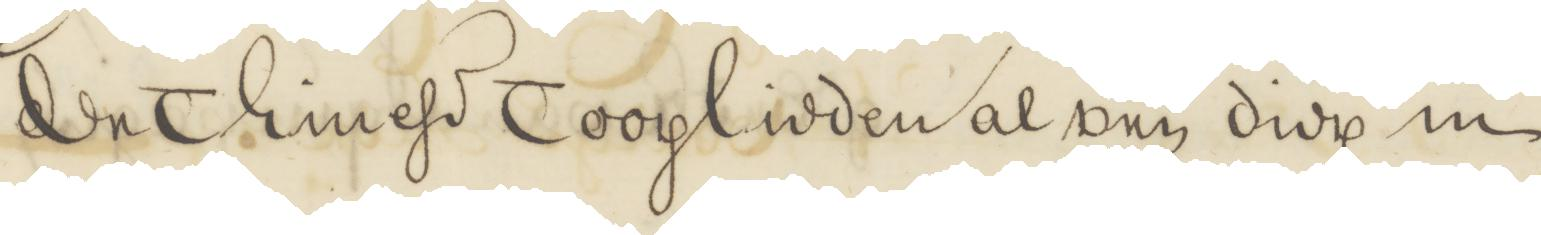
der Chinese Cooplieden al vrij diep in
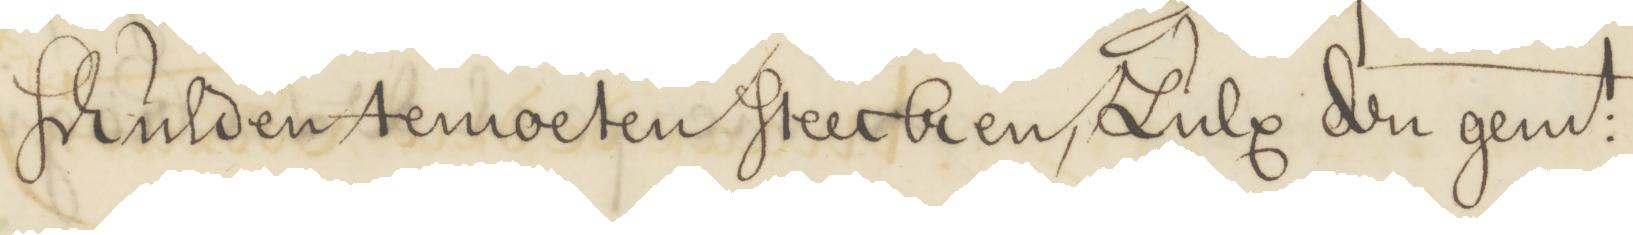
schulden temoeten steecken, zulx den gem:t
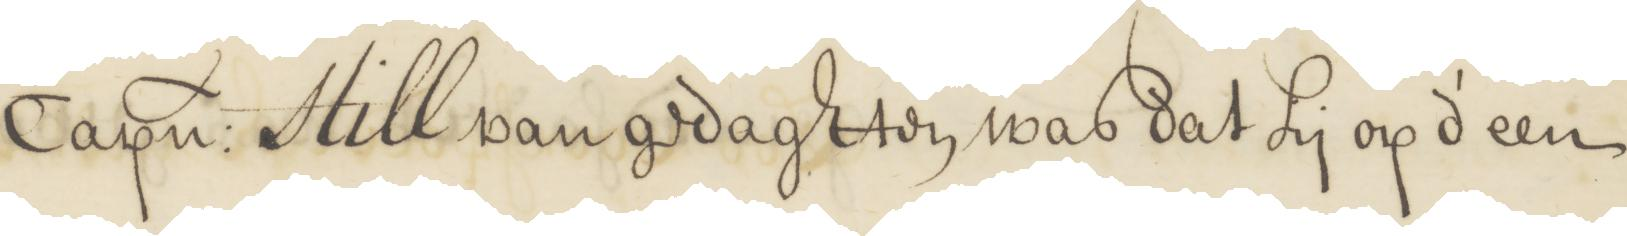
Capn: Hill van gedaghten was dat sij op d’een
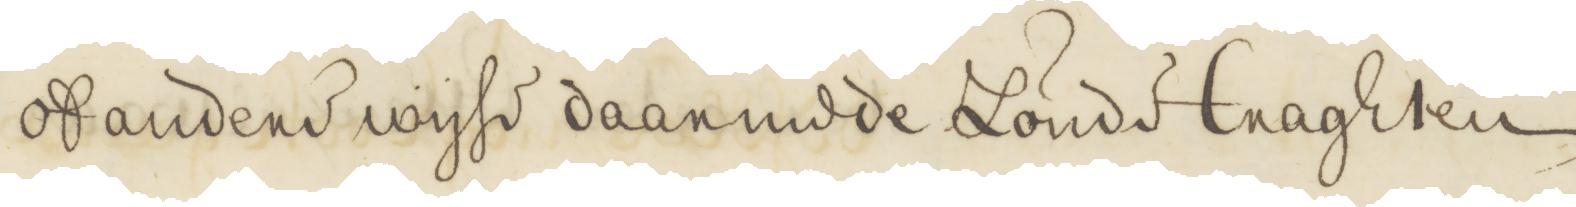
of andere wijse daarmede zoude traghten
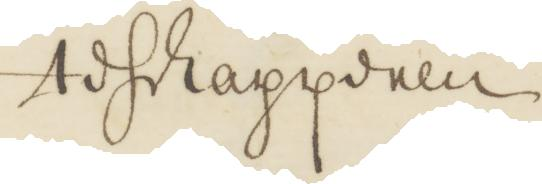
teschapperen.
